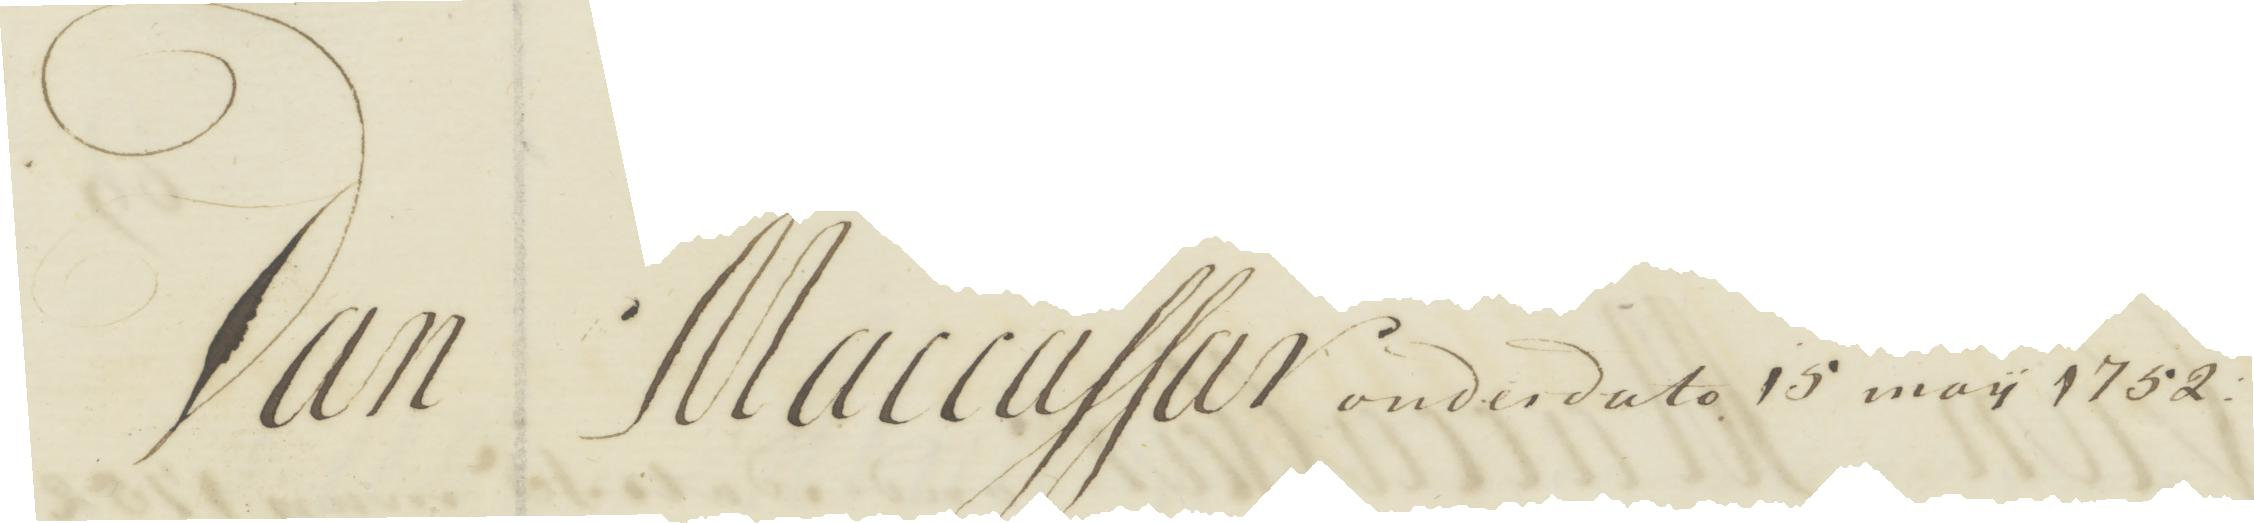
Van Maccassar onder dato 15 maij 1752:
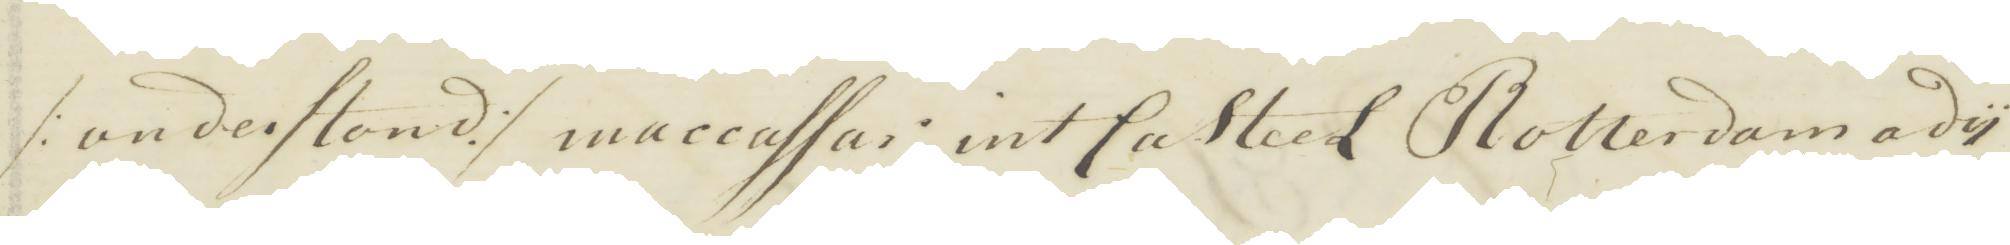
/:onderstond:/ maccassar in't Casteel Rotterdam adij
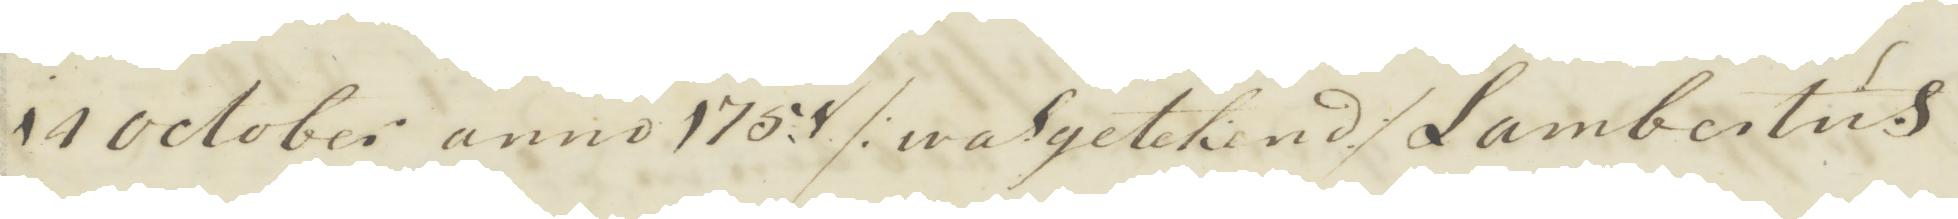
14 october anno 1751 /:was getekend:/ Lambertus
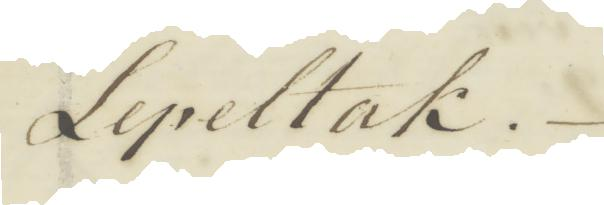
Lepeltak.—
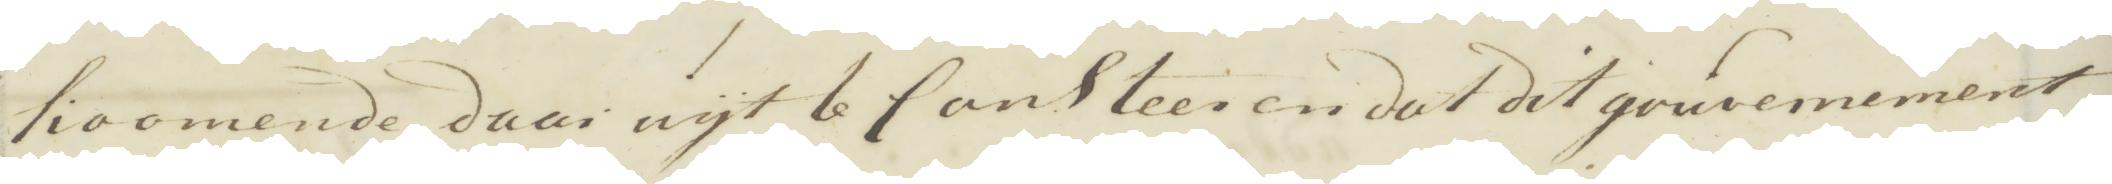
koomende daar uijt te Consteeren dat dit gouvernement
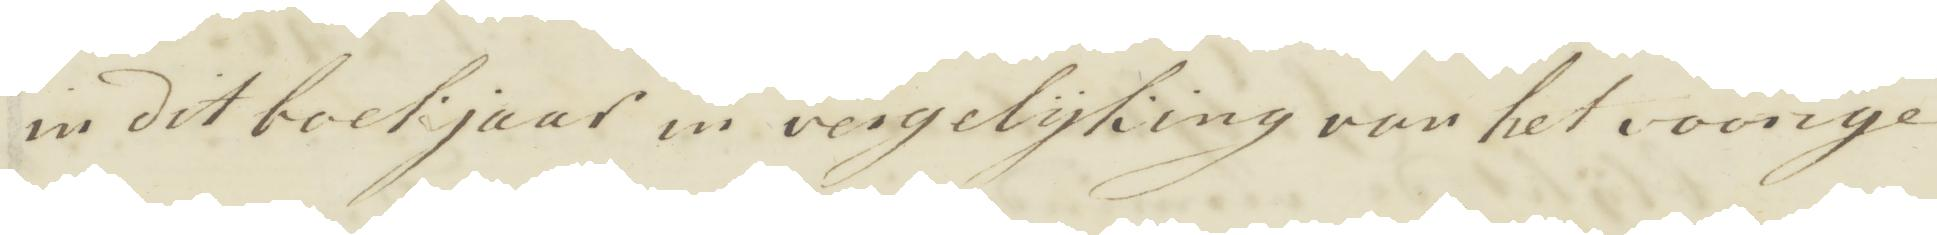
in dit boekjaar in vergelijking van het voorige
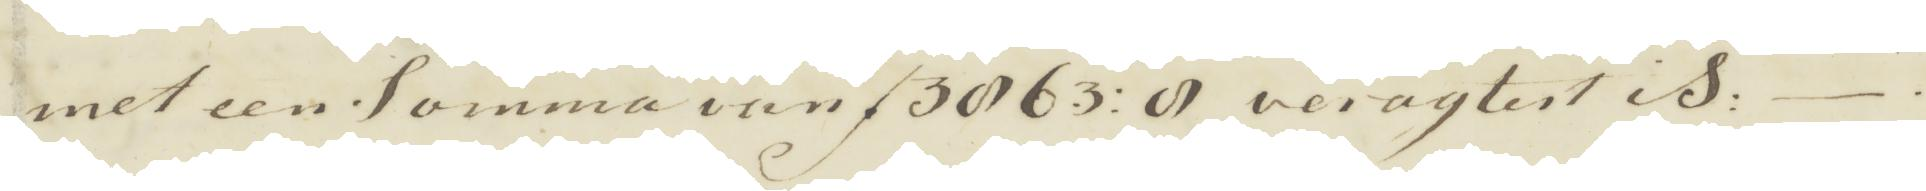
met een somma van ƒ3863: 8 veragtert is:—.
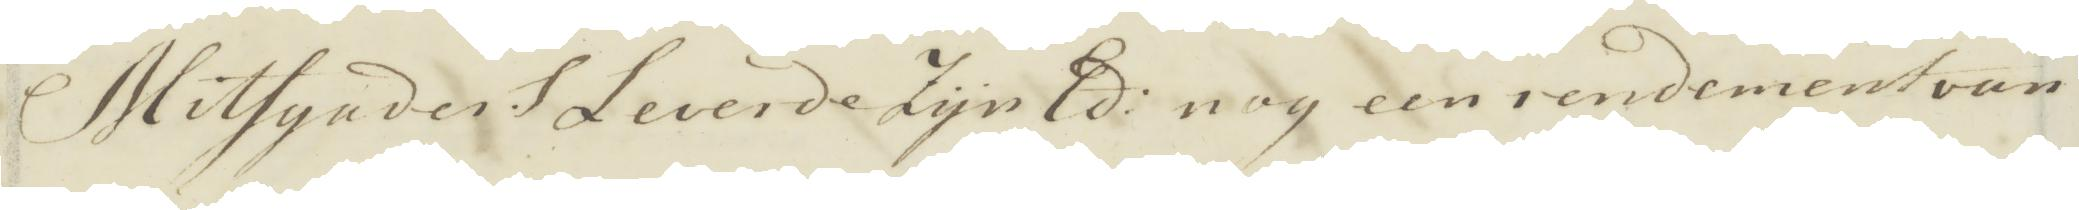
Mitsgaders Leverde zijn Ed: nog een rendement van
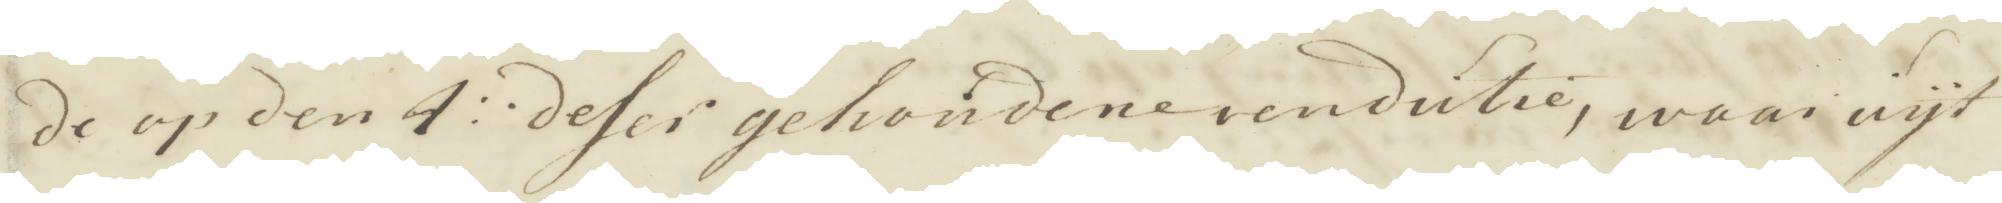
de op den 4:. deser gehoudene vendutie, waar uijt
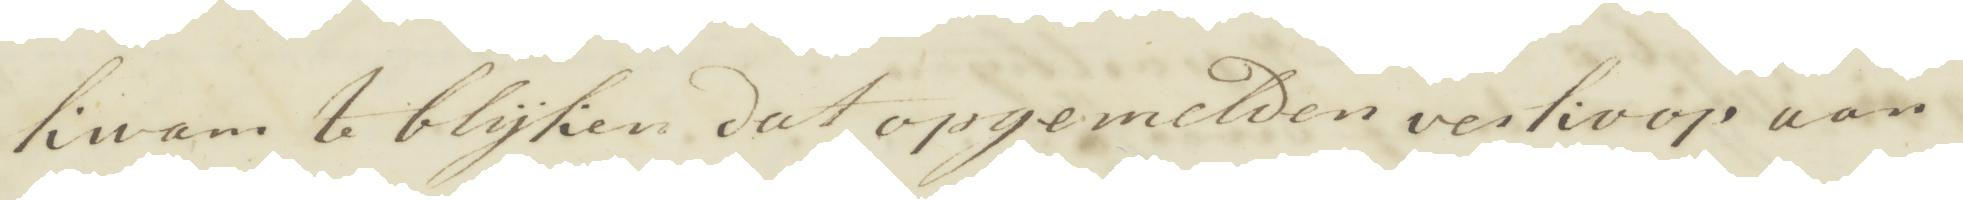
kwam te blijken dat opgemelden verkoop aan
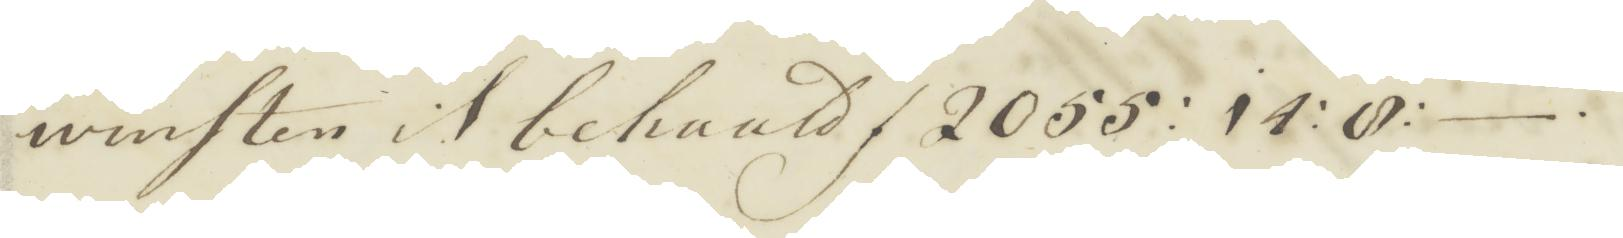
winsten is behaald ƒ 2055:14:8:
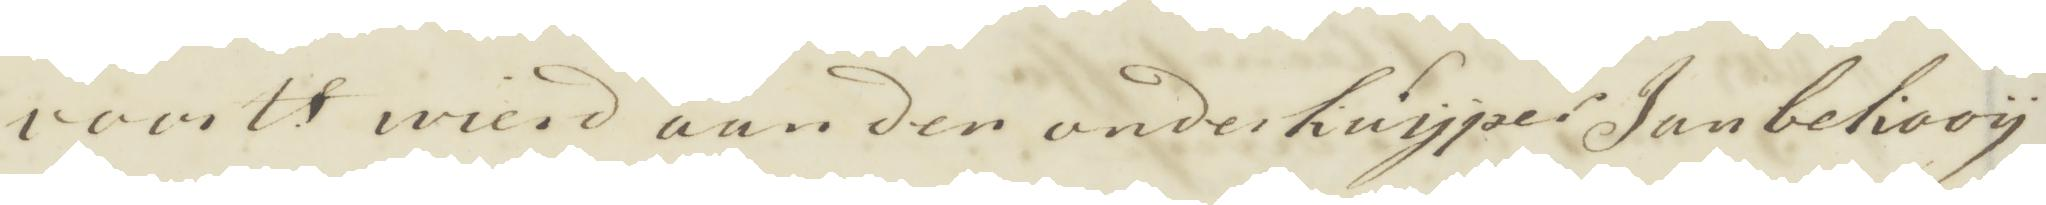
voorts wierd aan den onderkuijper Ian bekooij
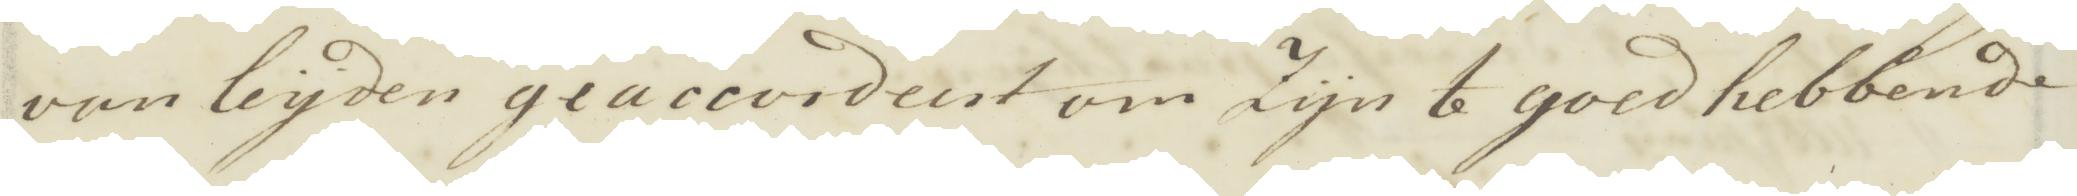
van leijden geaccordeert om zijn te goed hebbende
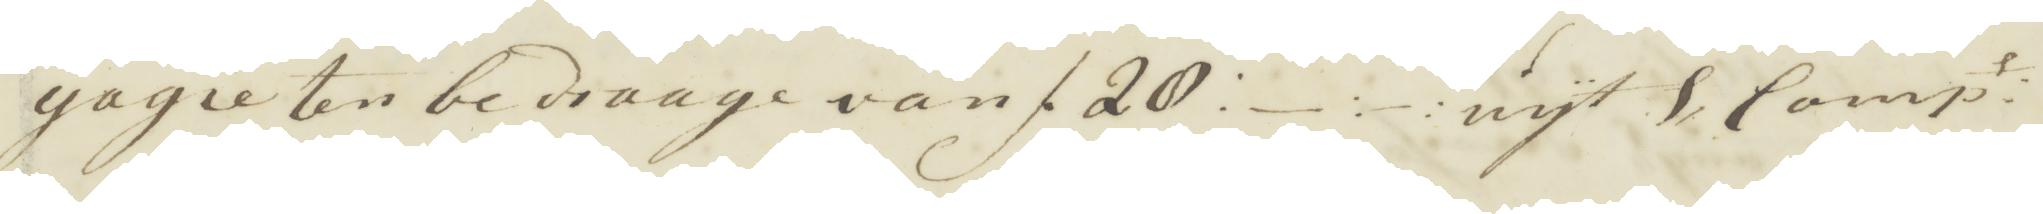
gagie ten bedraage van ƒ 28:—:—: uijt s: Comp:s
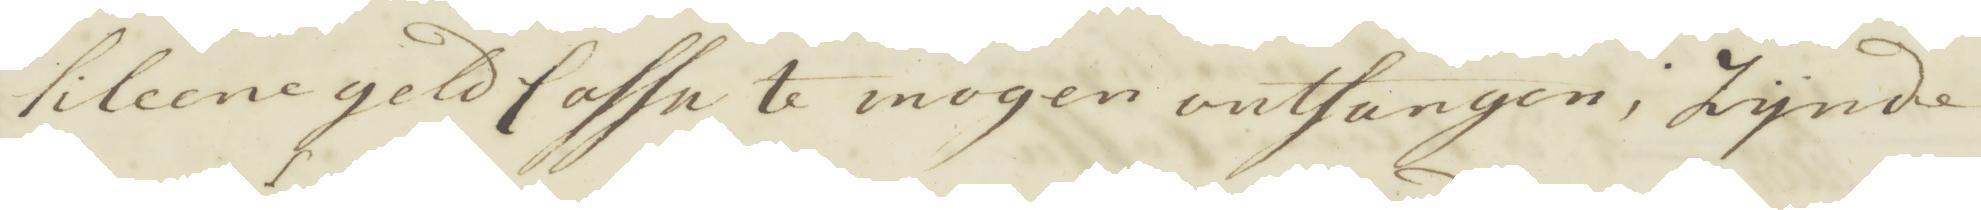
kleene geld Cassa te mogen ontfangen; zijnde
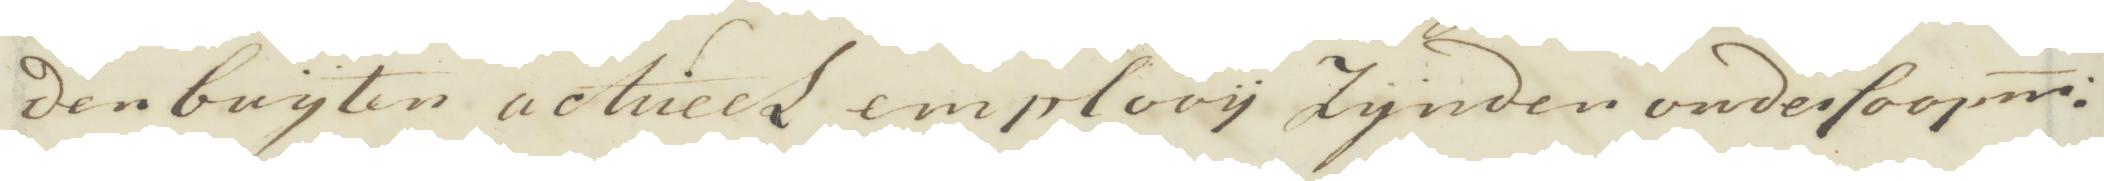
den buijten actueel emplooij zijnden ondercoopm:
